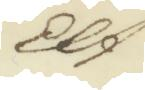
Elf
